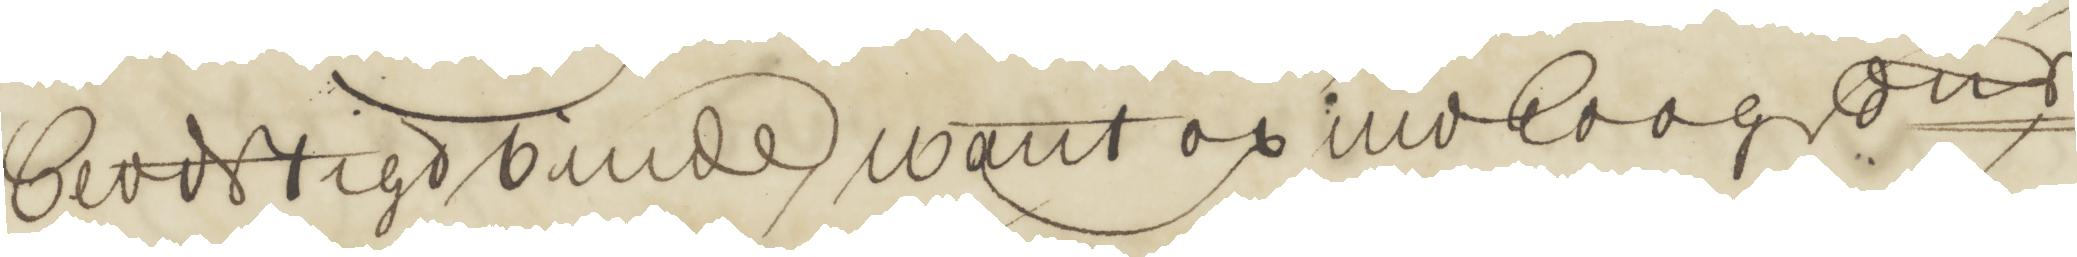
bevestigd vinde want op uw hoog Ed=ns
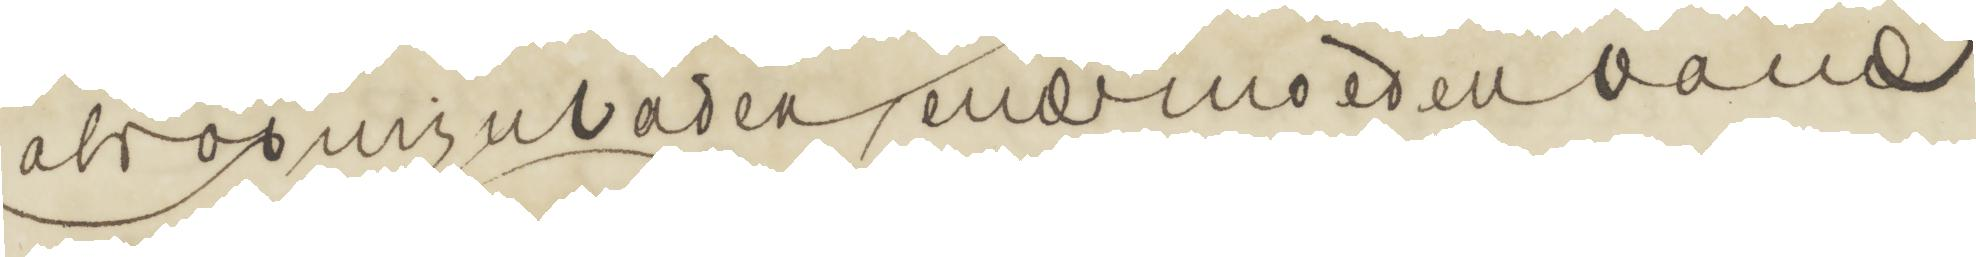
als op mijn vader, ende moeder vande
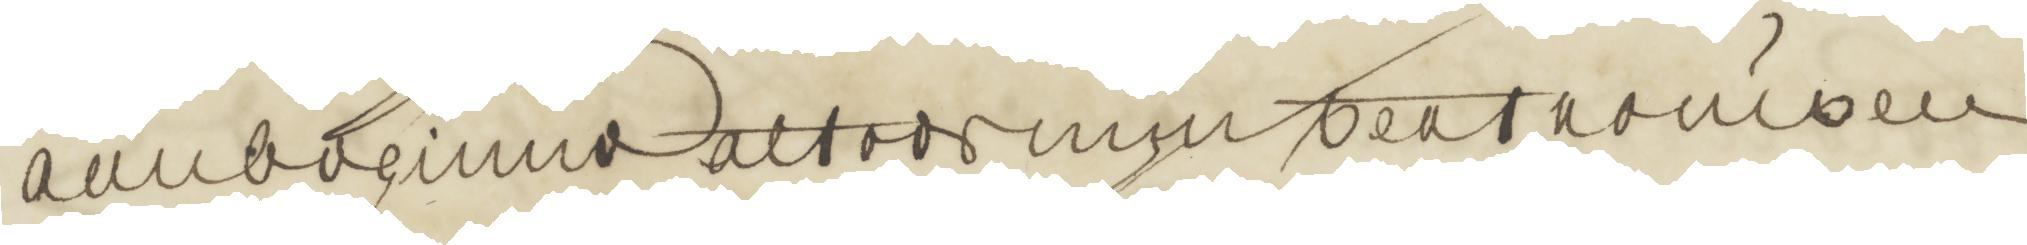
aanbeginne altoos myn vertrouwen
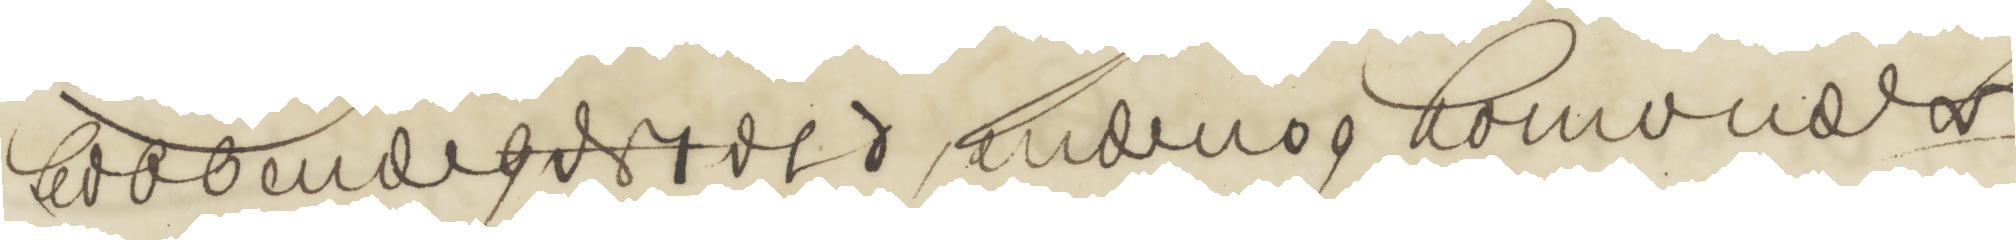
hebbende gesteld, ende nog komende te
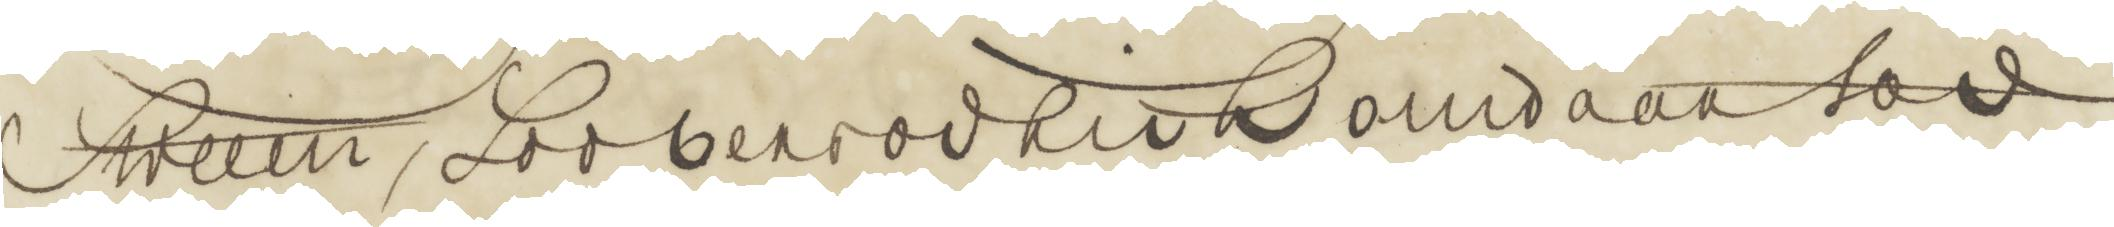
stellen, Soo versoek ick om daar toe
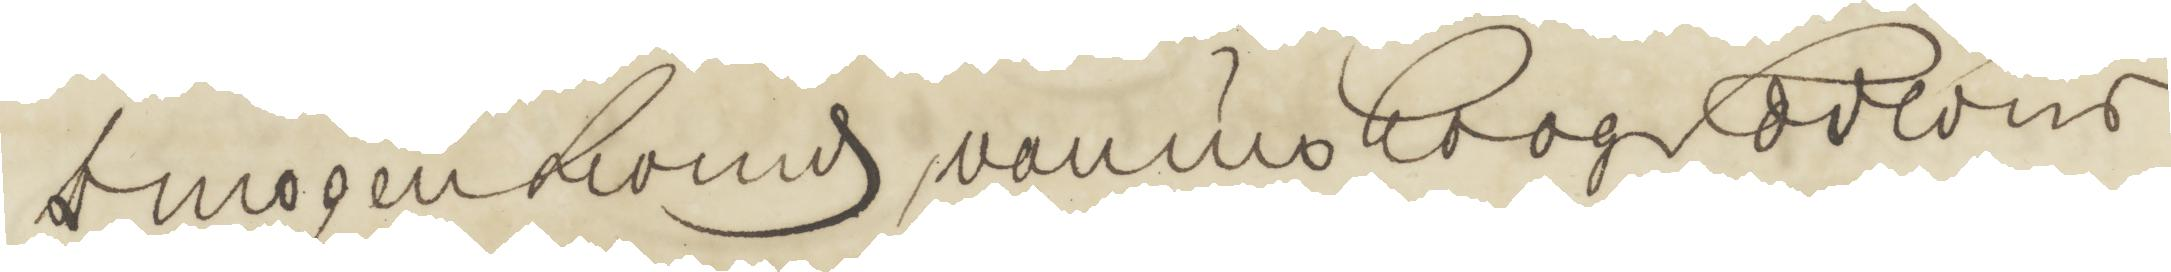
te mogen komen, van uw hoog Edelens
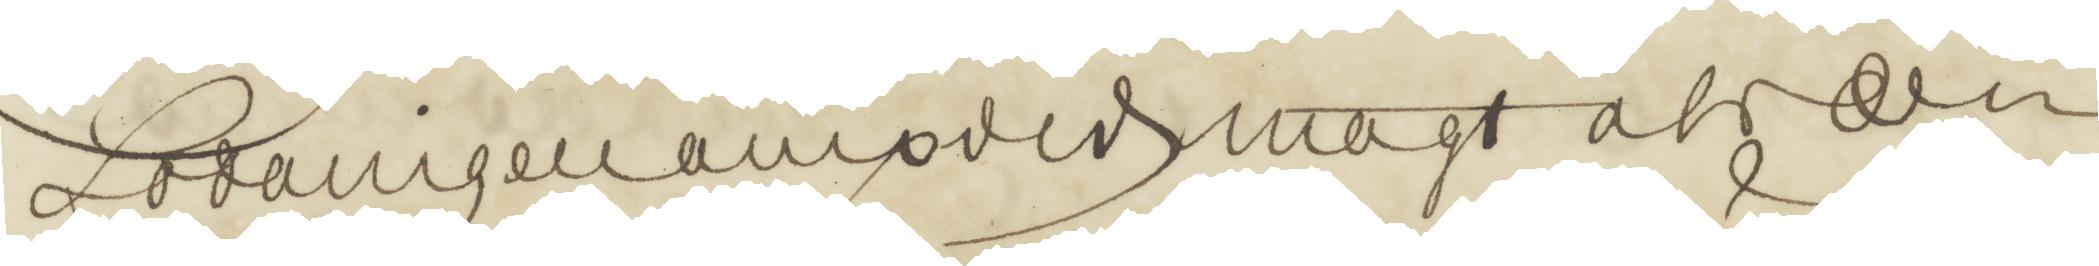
Sodanigen ampele magt als den
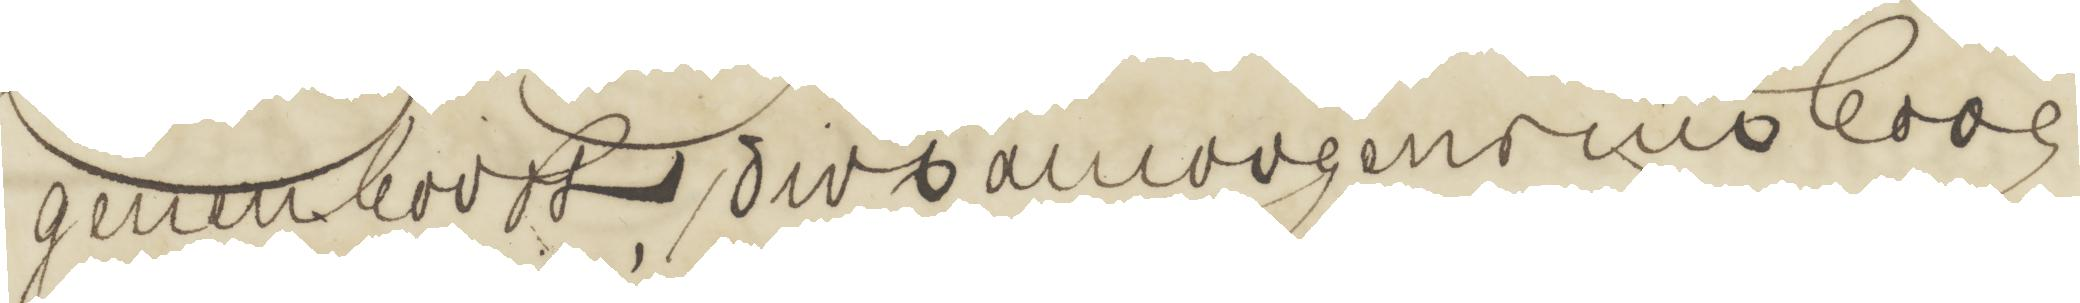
genen hoeft, die van wegens uw hoog
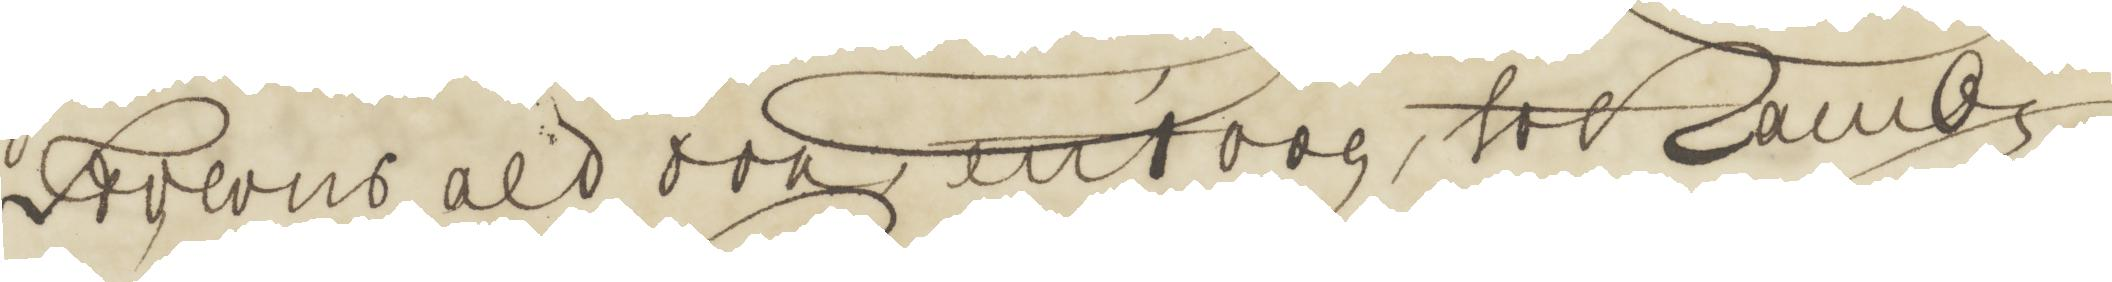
Edelens ald' oor en 't oog, tol Jamby
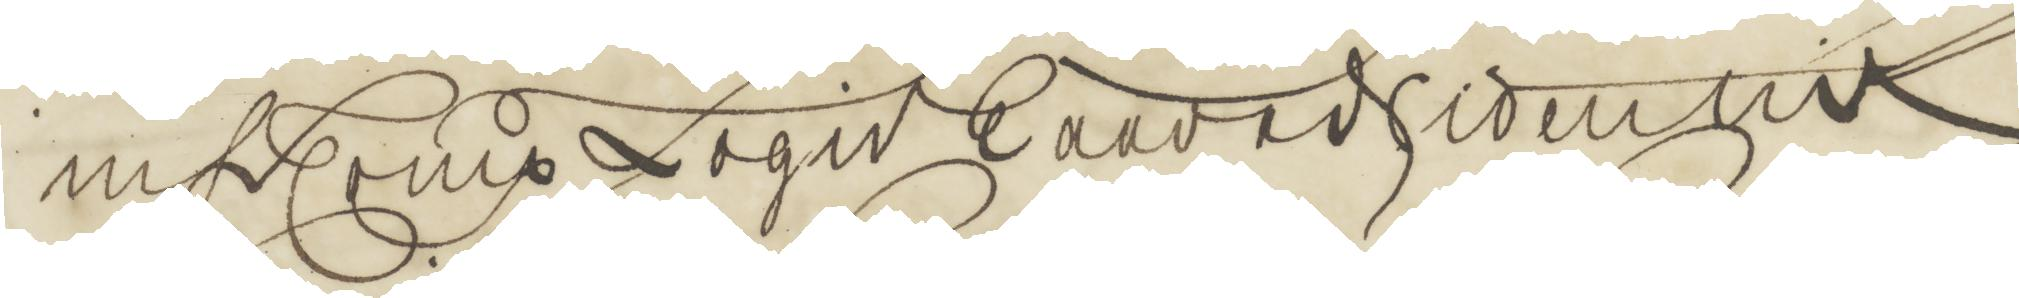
in SE Comp Logie hare residentie
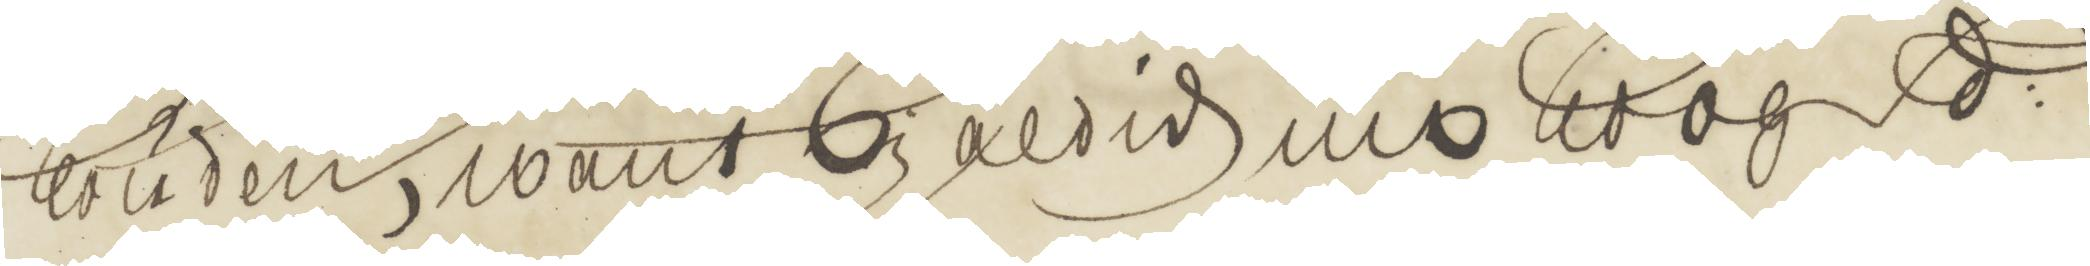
houden, want bij aldien uw hoog Ed:
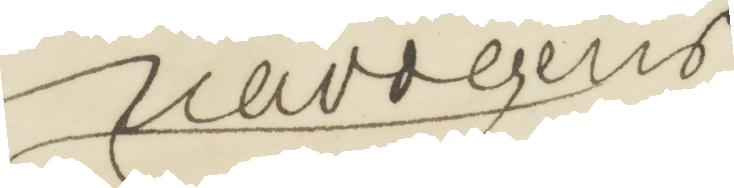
nae volgens
